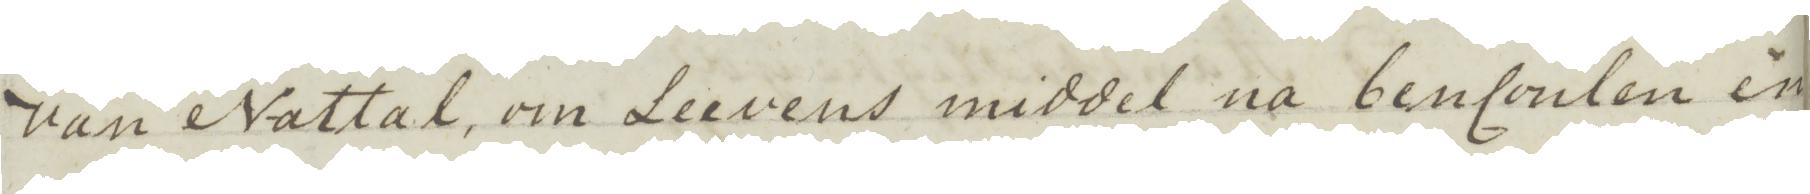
van Nattal, om Leevens middel na bencoulen en
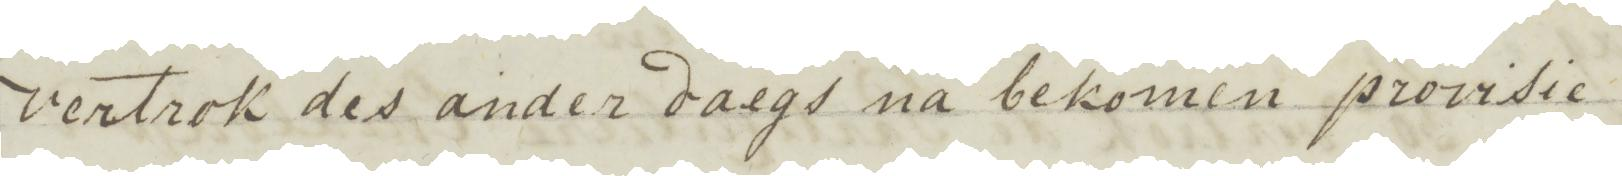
vertrok des ander daegs na bekomen provisie
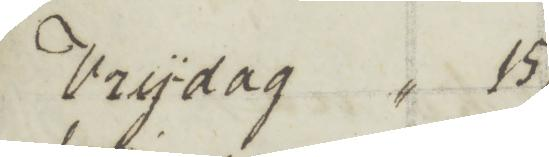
Vrijdag „ 15„e
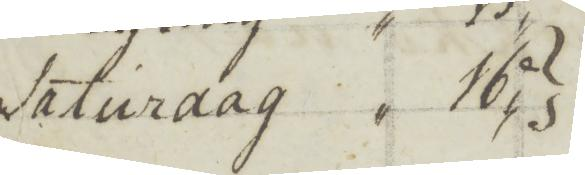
Saturdag „ 16„e }
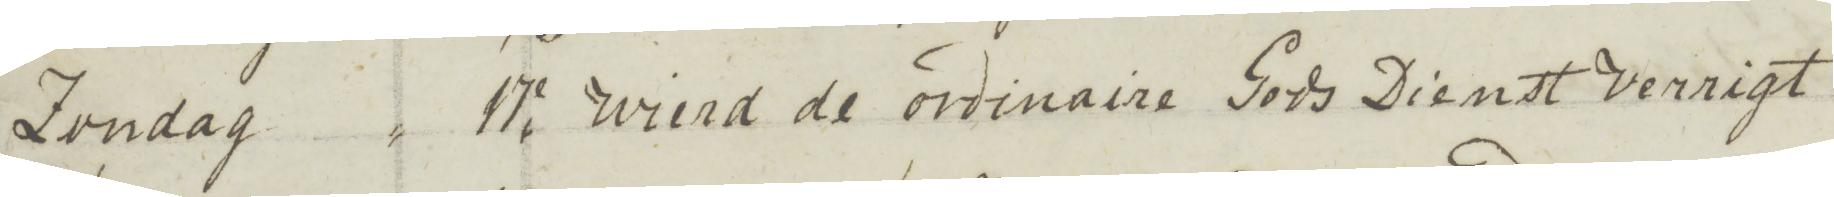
Zondag „ 17„e wierd de ordinaire Gods Dienst verrigt
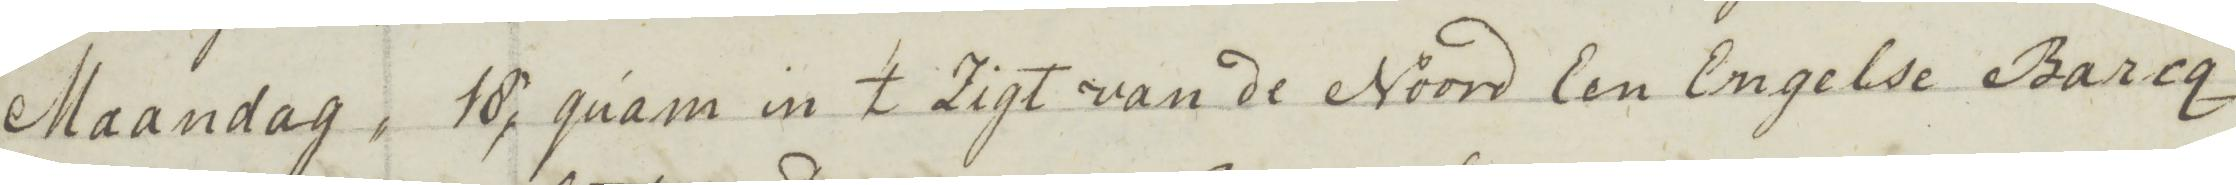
Maandag „ 18„e quam in ’t Zigt van de Noord Een Engelse Barcq
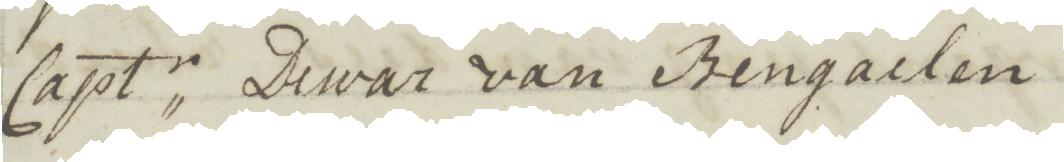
Capt„n Dewar van Bengaelen
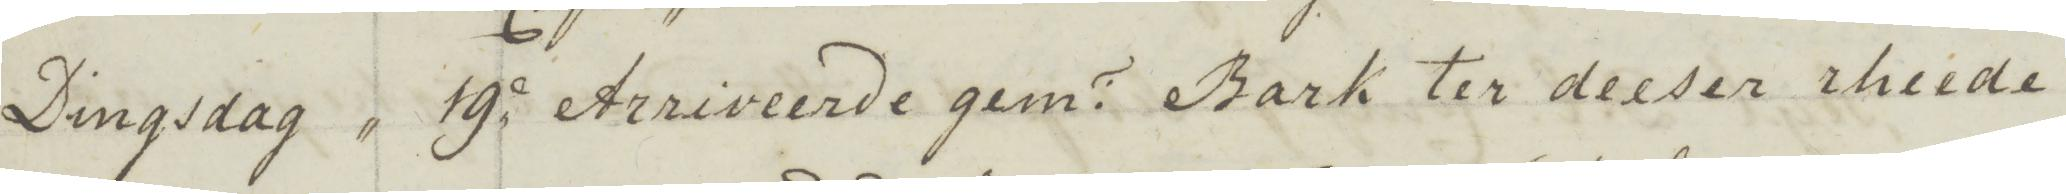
Dingsdag „ 19„e Arriveerde gem: Bark ter deeser rheede
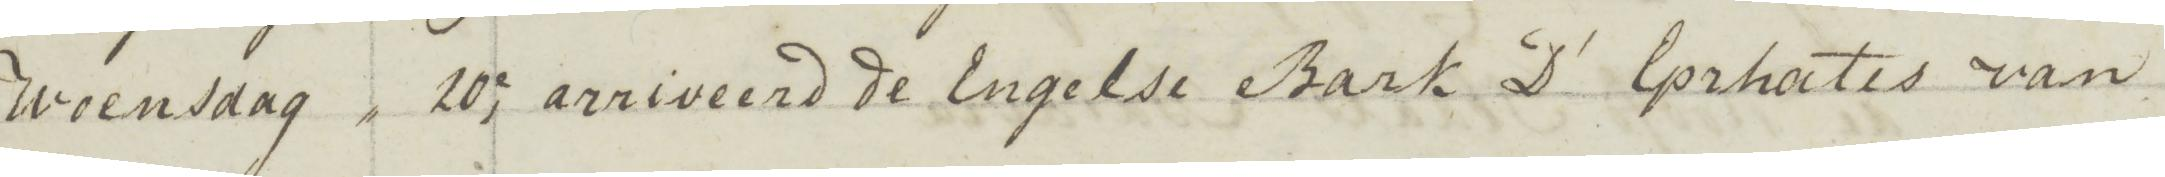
Woensdag „ 20„e arriveerd de Engelse Bark D' Eprhates van
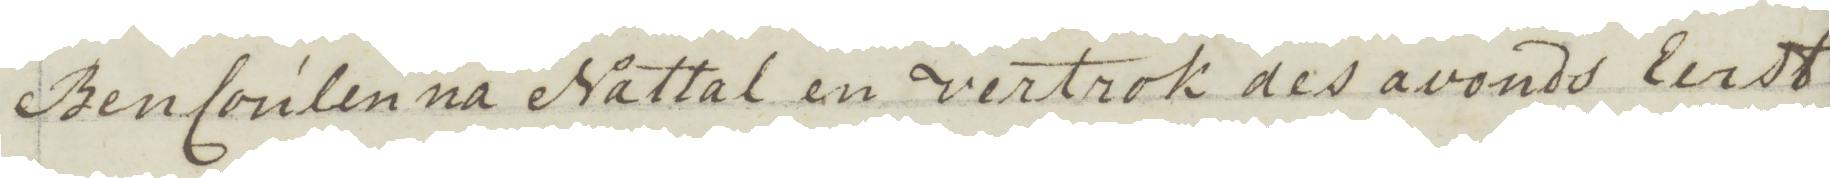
Bencoulen na Nattal en vertrok des avonds Eerst
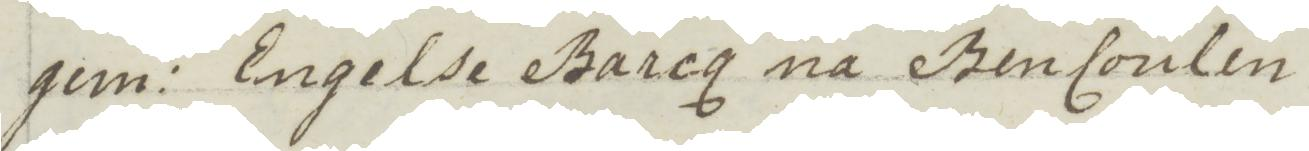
gem:' Engelse Barcq na Bencoulen
